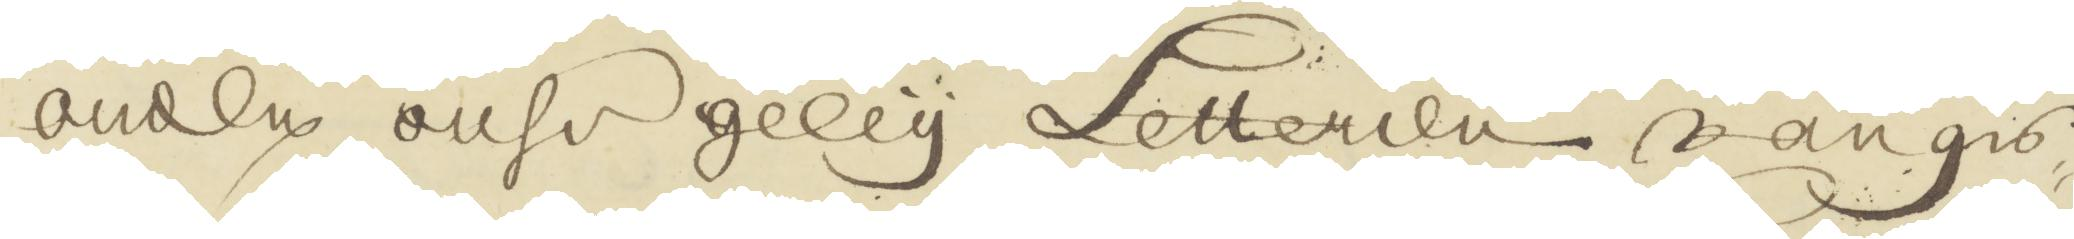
onder onse geleij Letteren van gis„
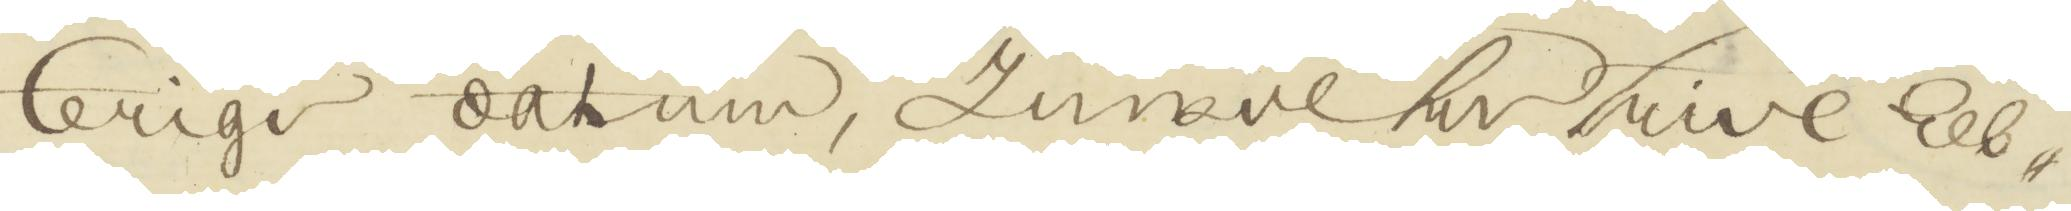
terige datum, Inwelke kiel heb„
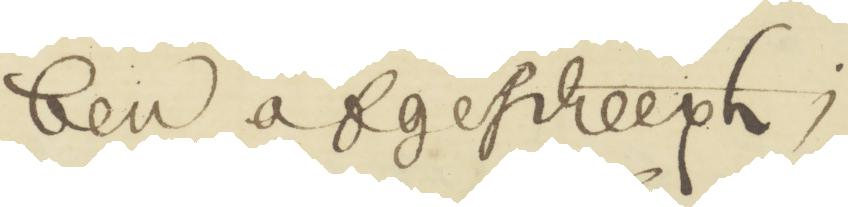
ben afgescheept;
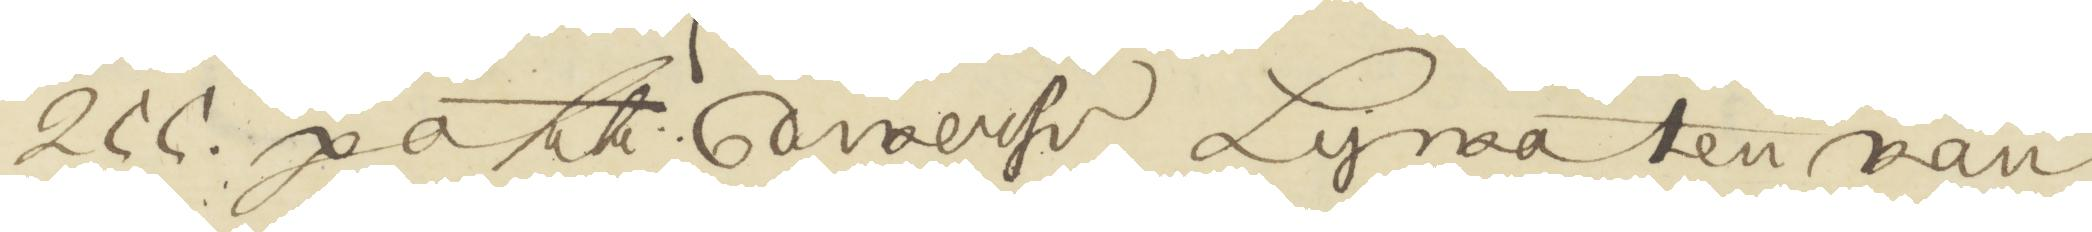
255. pakk: diverse Lijwaten van
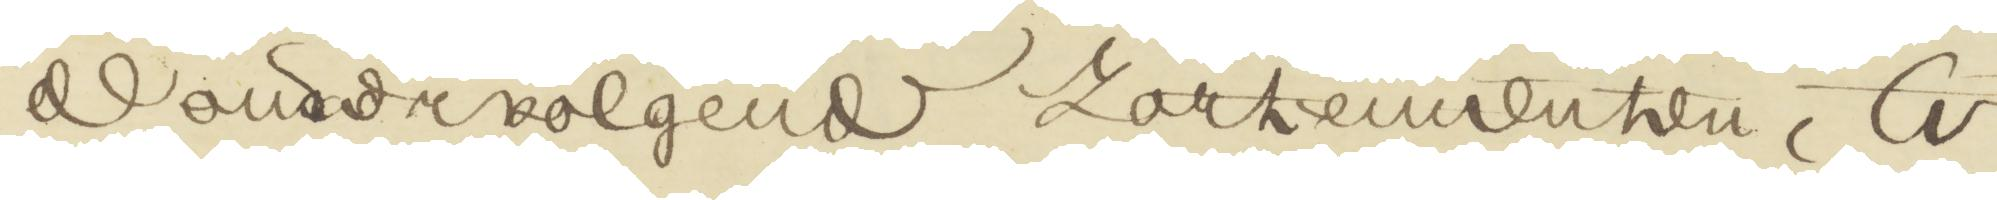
de ondervolgende zortementen, te
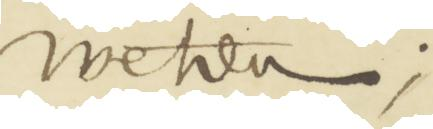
weten;
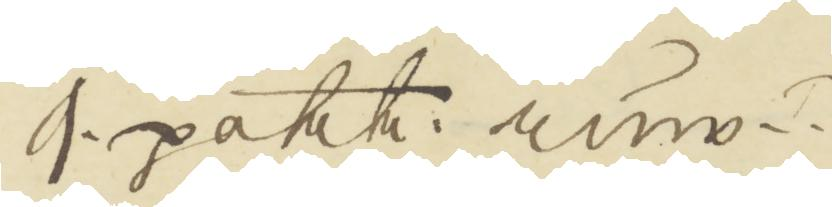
4. pakk: ruw-
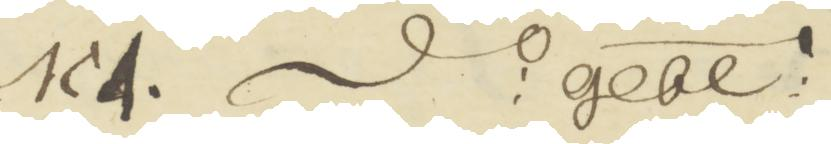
154. d:o gebl:t
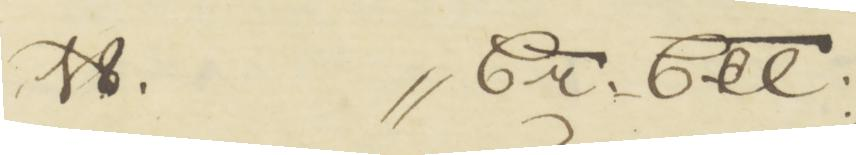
„18. „ br: bll
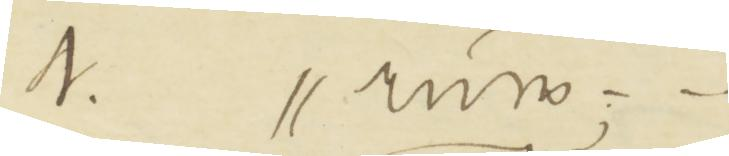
1: „ ruw:
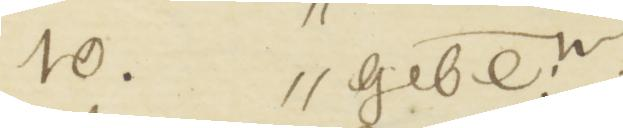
10. „ gebl:te
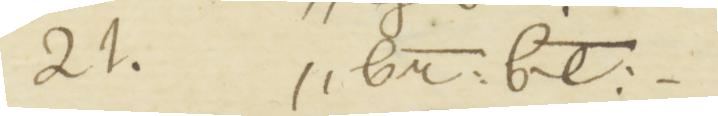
21. „br: bl:
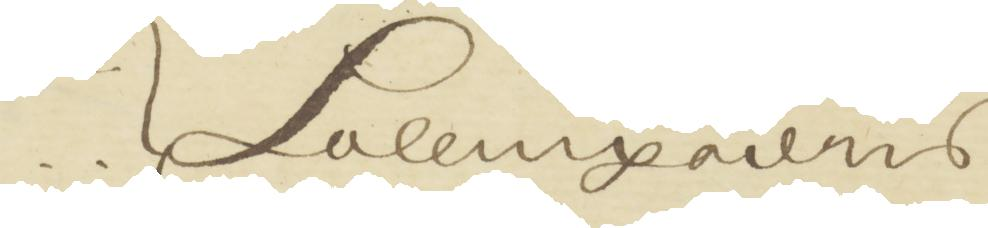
- - } Salempoeris
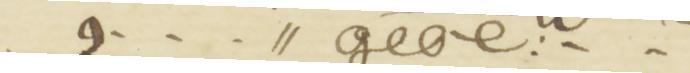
9- - - „ gebl:te - -
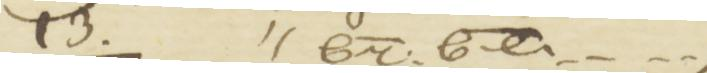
13. „ br: bl:- - - -
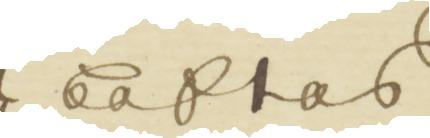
baftas
